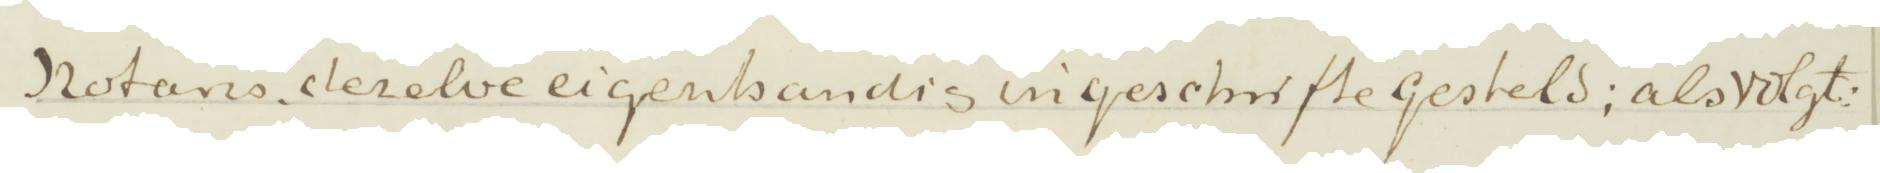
notaris dezelve eigenhandig in geschrifte gesteld, als Volgt:
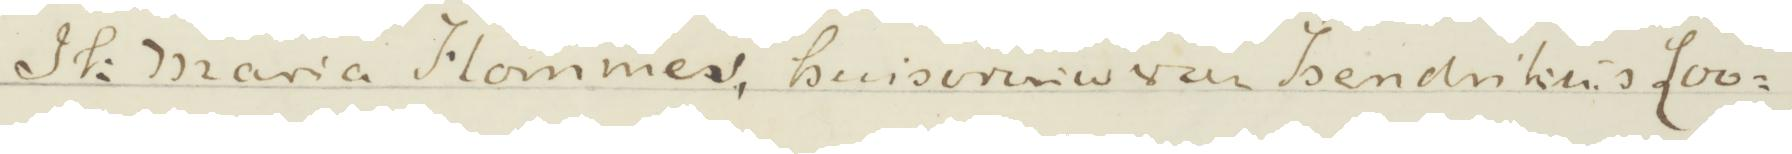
Ik Maria Hommes, huisvrouw van Hendrikus Loo=
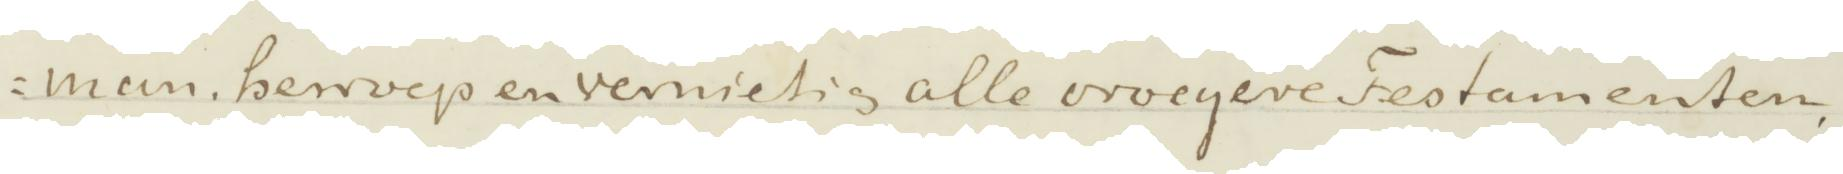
=man hervoep en vernietig alle vroegere Testamenten
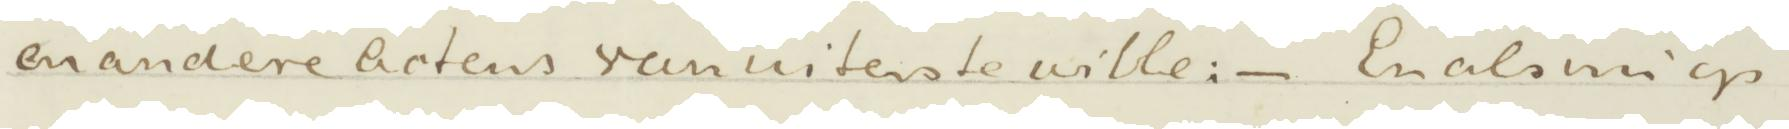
en andere actens van uiterste wille:- En als nu op
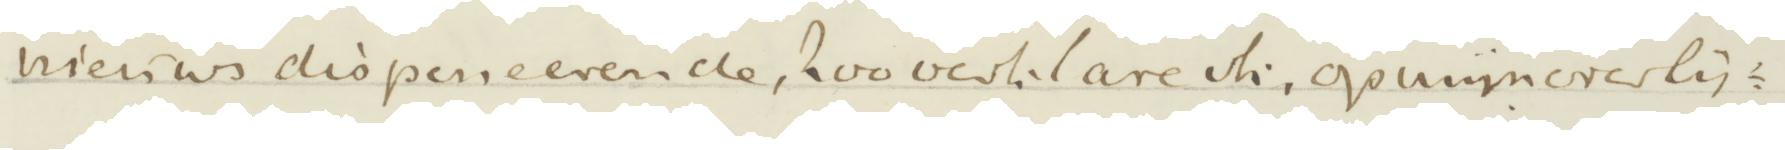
nieuw disponeerende, Zoo verklare ik op mijn overlij=
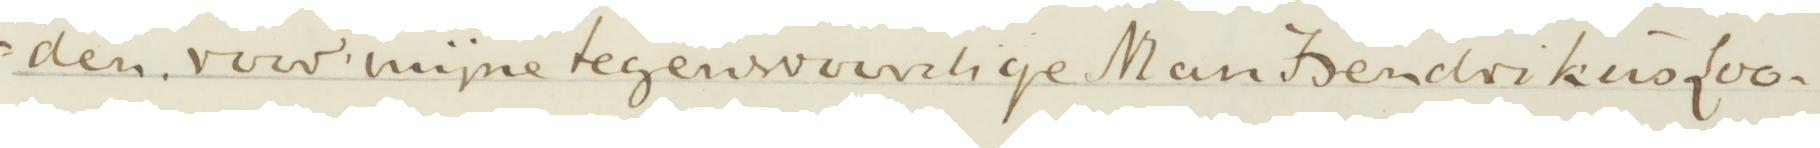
=den voor mijne tegenwoordige Man Hendrikus Loo=
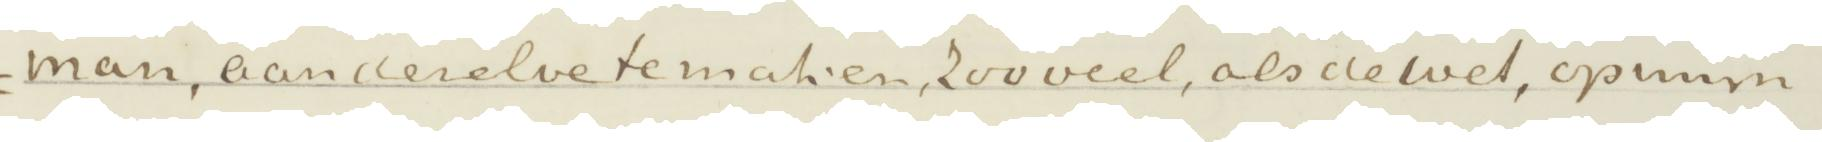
=man, aan dezelve te maken, Zoo veel, als de wet, op myn
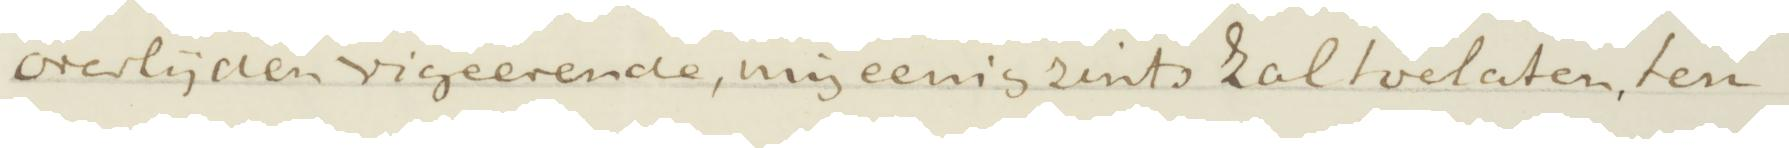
overlijden vigeerende, mij eenig zints Zal toelaten, ten
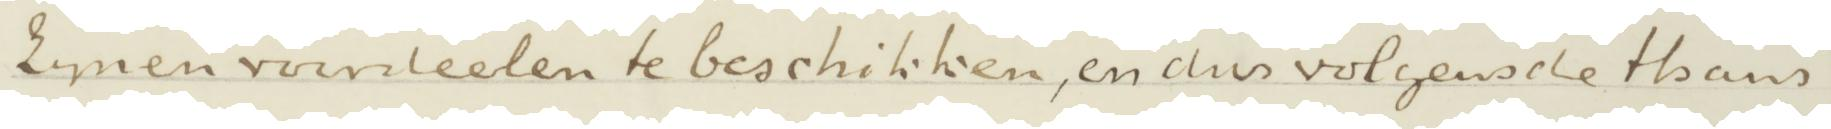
Zynen voordeelen te beschikken, en dus volgens de thans
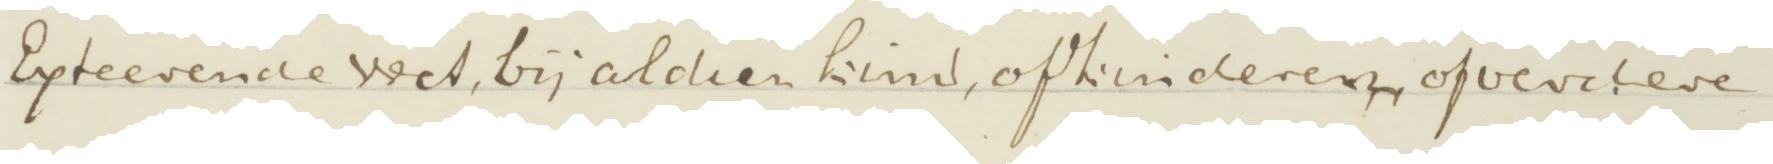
Exteerende wet, bij aldien kind, of kinderen, of verdere
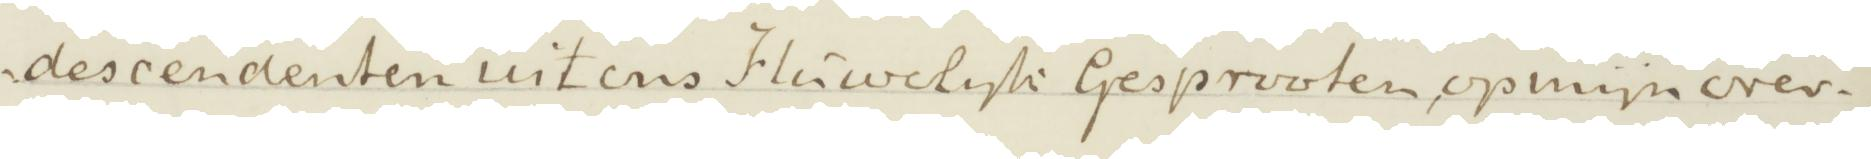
descendenten uit ons Huwelyk gesprooten, op mijn over=
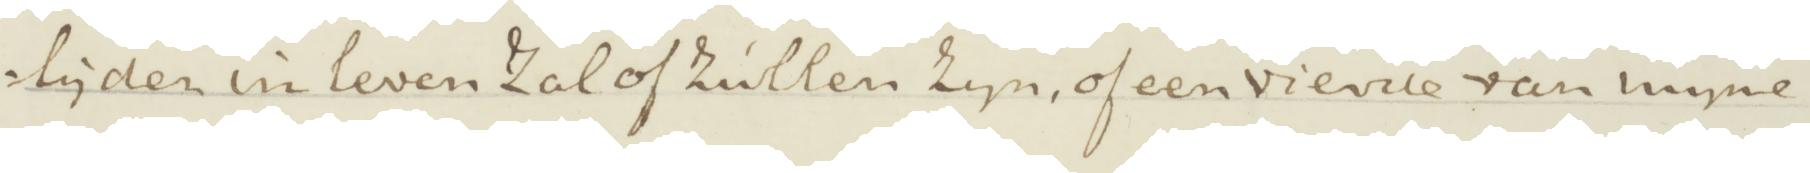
=lijden in leven Zal of Zullen Zijn, of een vierde van myne
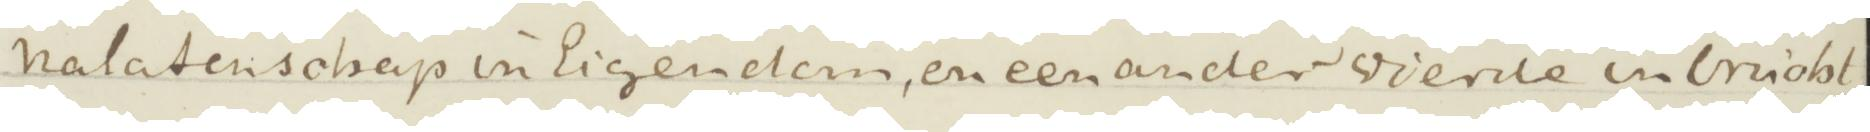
nalatenschap in Eigendom, en een ander vierde in 't vrucht
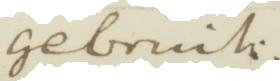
gebruik,
